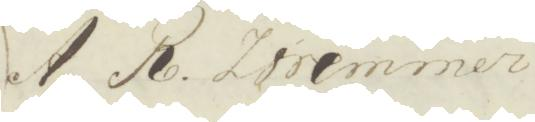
A R. Zwemmer
